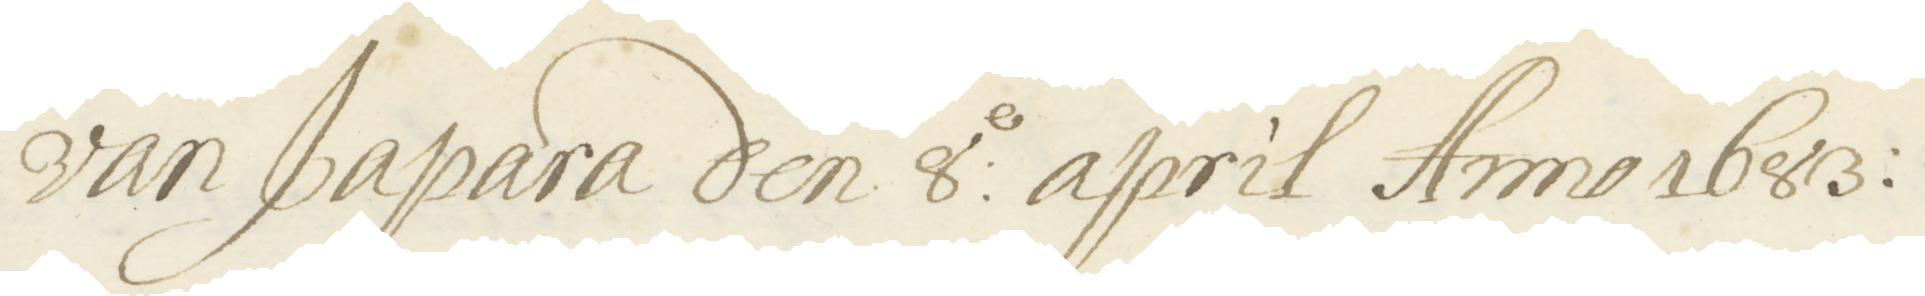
van Japara den 8:e april Anno 1683:
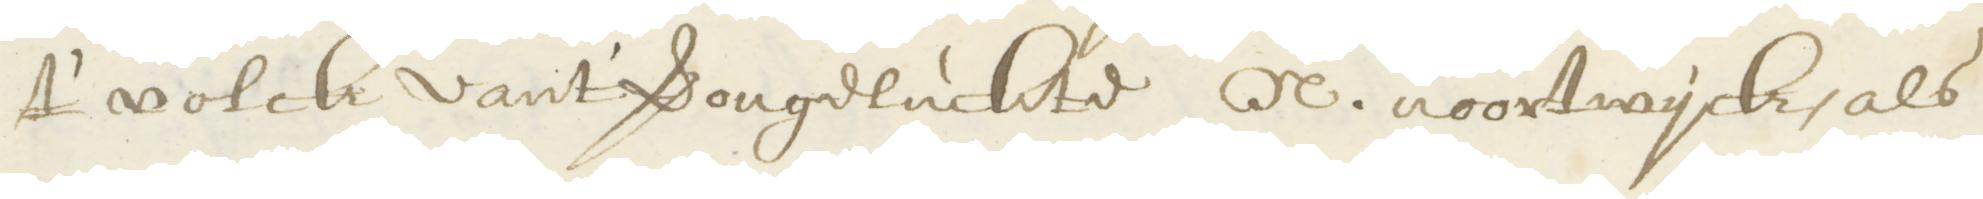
t' volck vant' verongeluckte N. noortwijck, als
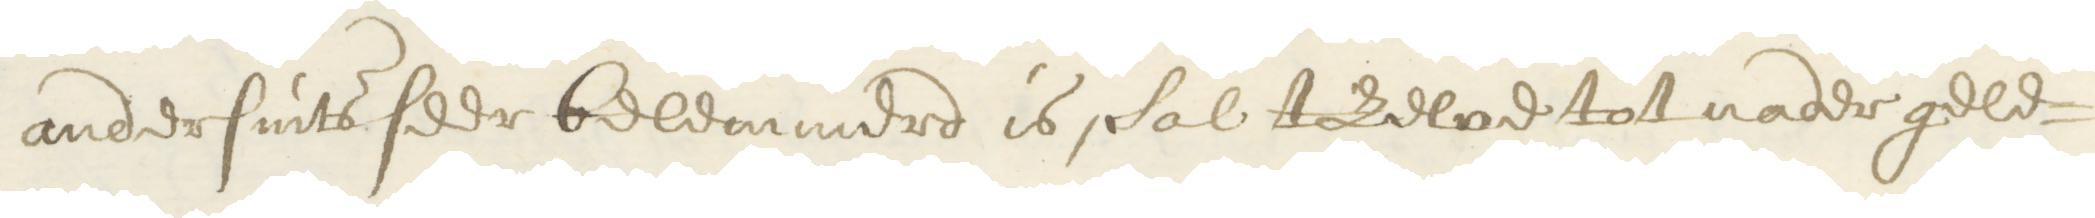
andersints seer belemmerd is, sal t'zelve tot nader gele=
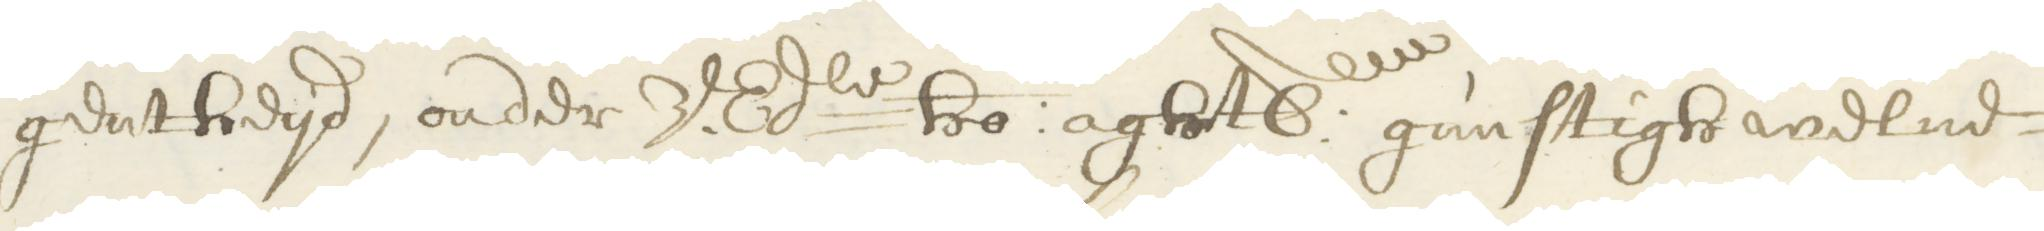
gentheijd, onder V.Ed=le ho: aghtb: gunstigh welne=
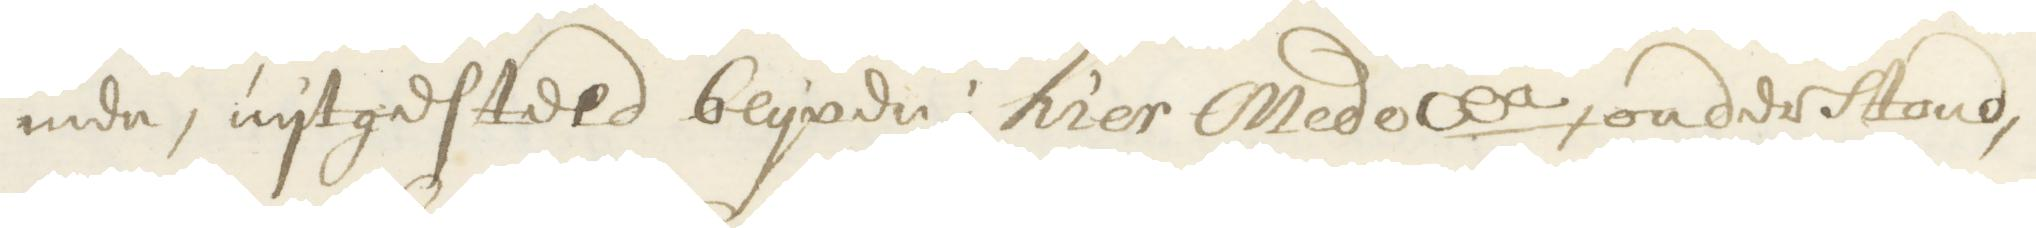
men, uijtgesteld blijven; hier medewa, onderstond,
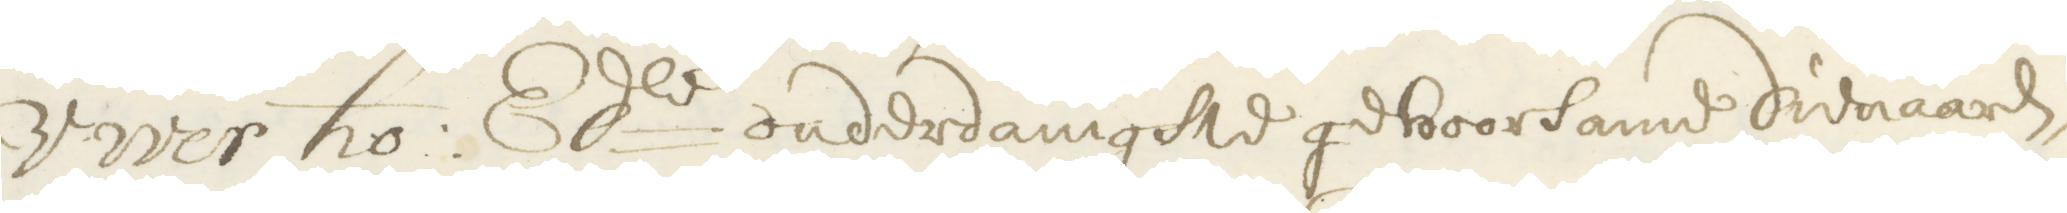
Vwer ho: Ed=le onderdanigste gehoorsame dienaaren
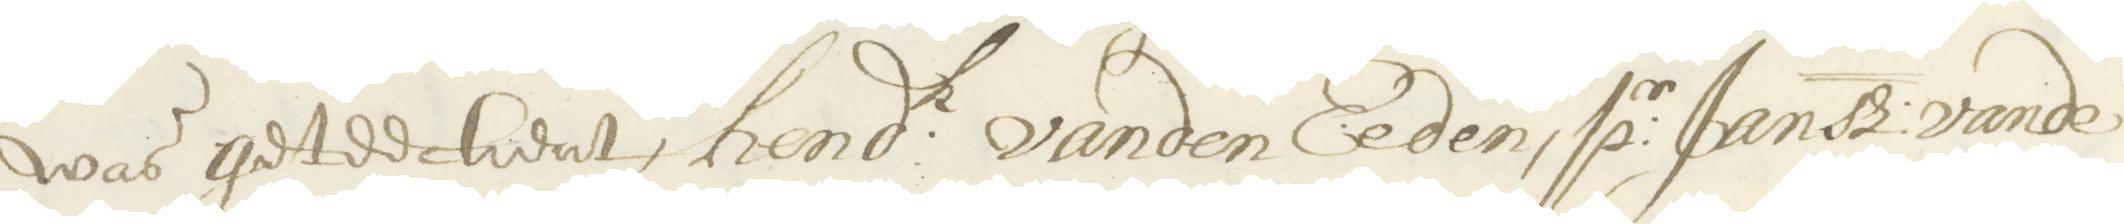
was geteeckent, hend:k vanden Eeden, p:r Jansz: van de
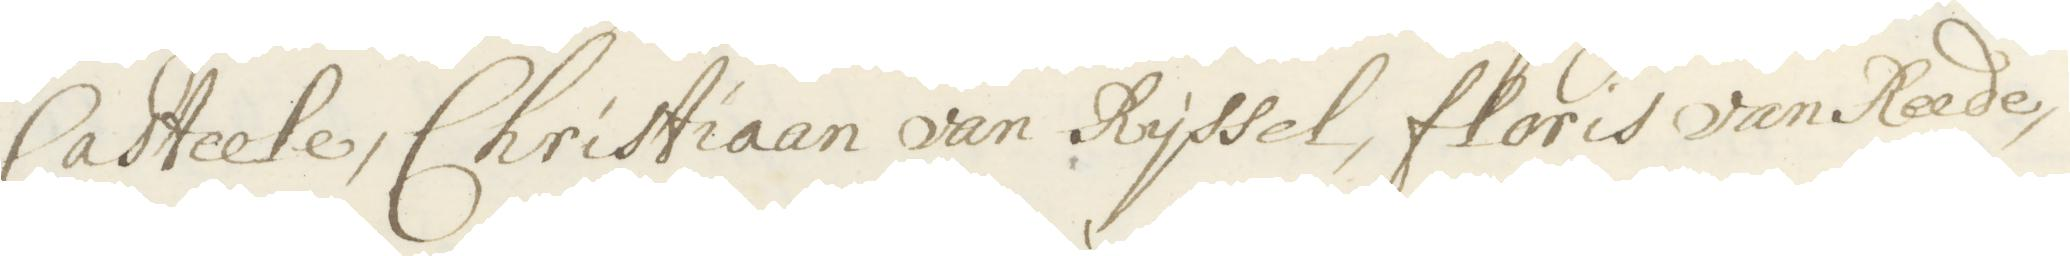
Casteele, Christiaan van Rijssel, floris van Reede,
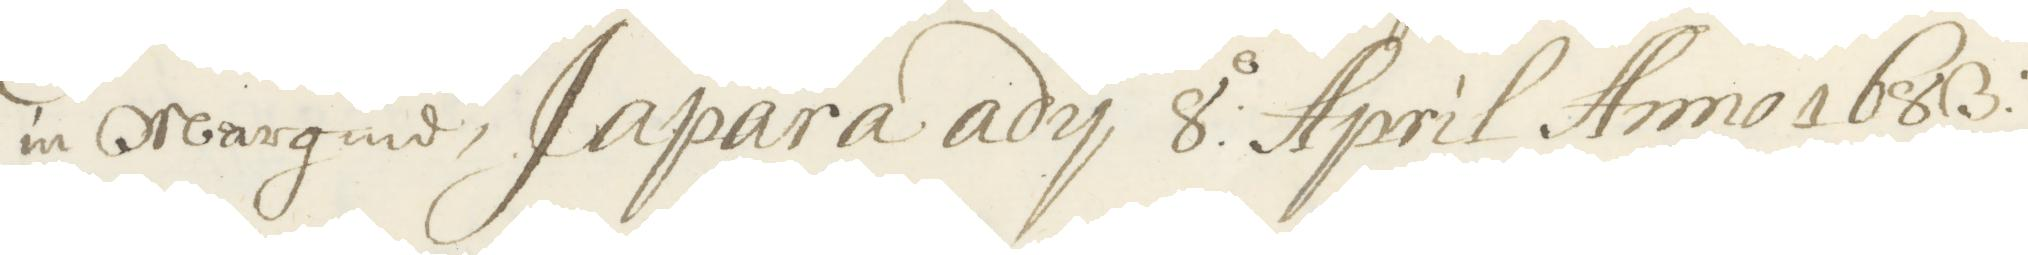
in Margine, Japara adij 8:e April Anno 1683:
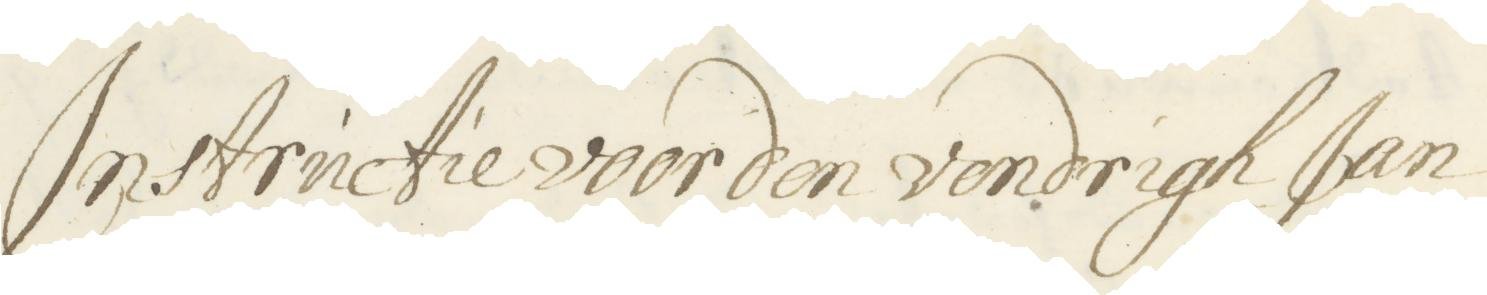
Jnstructie voor den vendrigh Jan
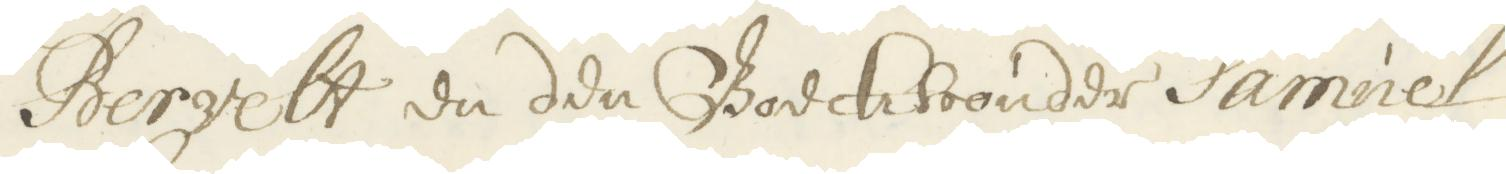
Bervelt en den Boeckhouder samuel
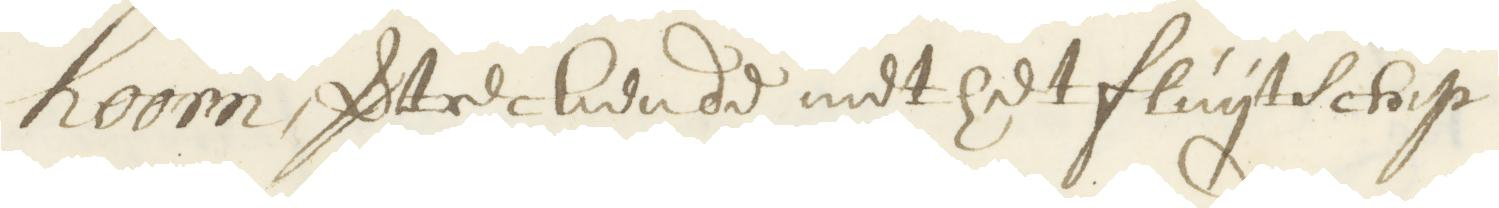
hoorn, vertreckende met het fluijtschip
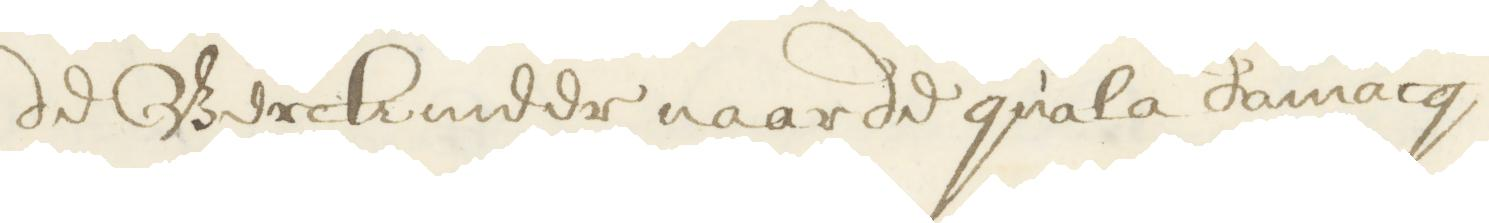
de Berckmeer naar de quala damacq
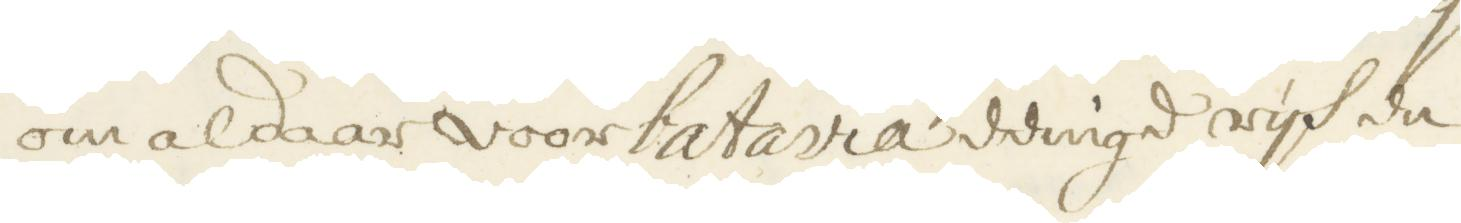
om aldaar voor batavia eenige rijs en
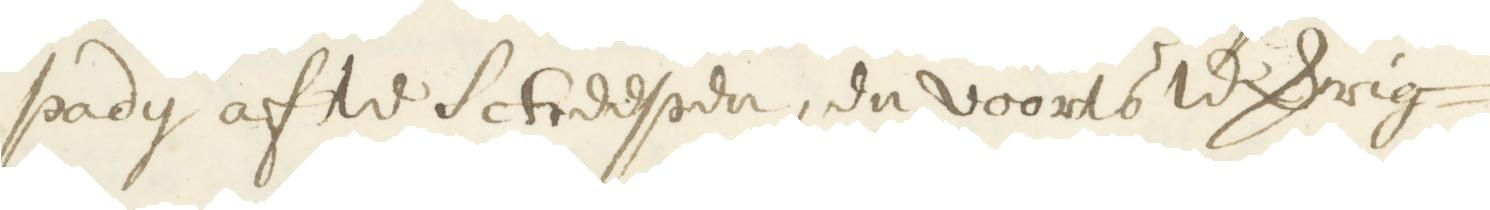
padij af te scheepen, en voorts te verrig=
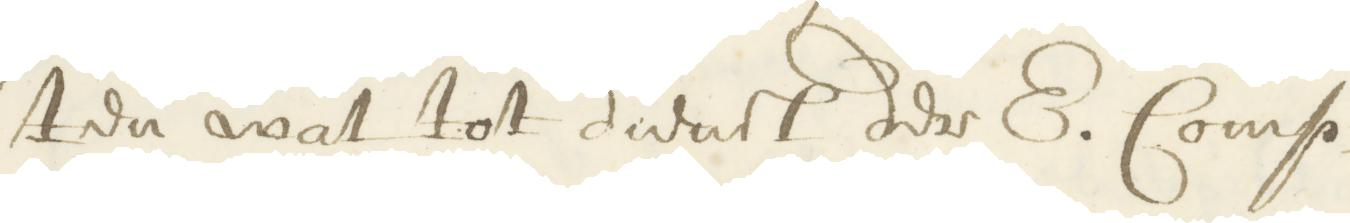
ten wat tot dienst der E. Comp=e
